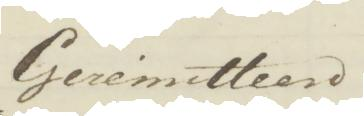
Geremitteerd
